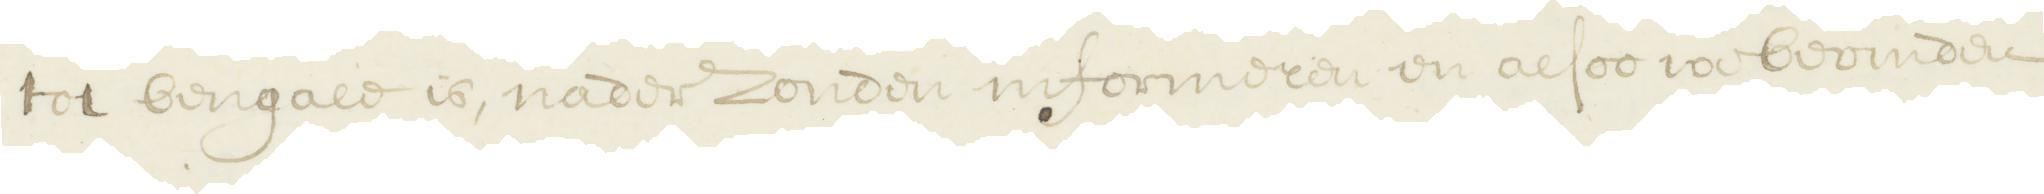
tot bengale is, nader zouden informeren en alsoo we bevinden
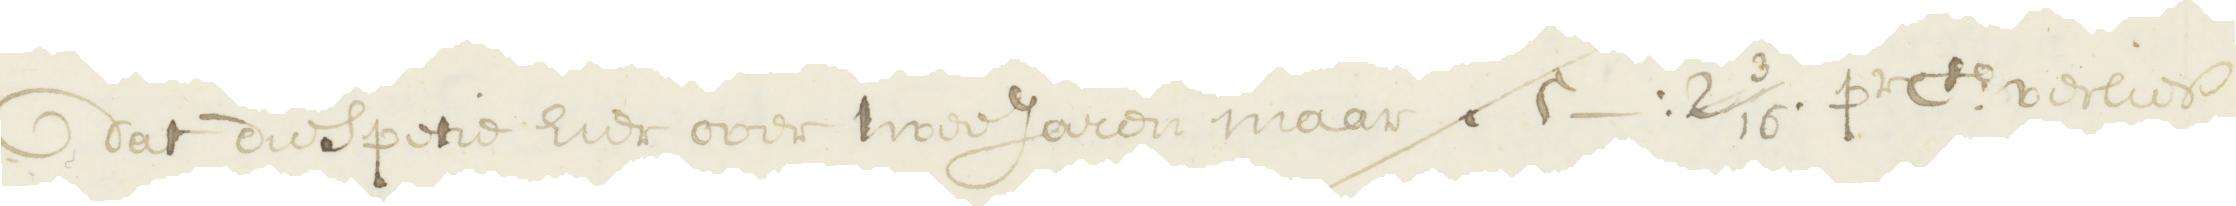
dat die spetie hier over twee Jaren maar ƒ5—:2 3/16. p:rC:to verlies
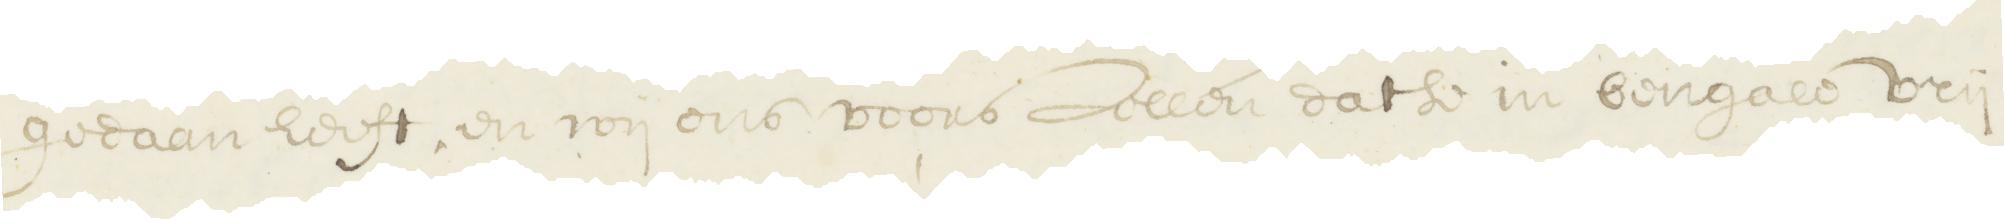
gedaan heeft, en wij ons voorstellen datse in bengale vrij
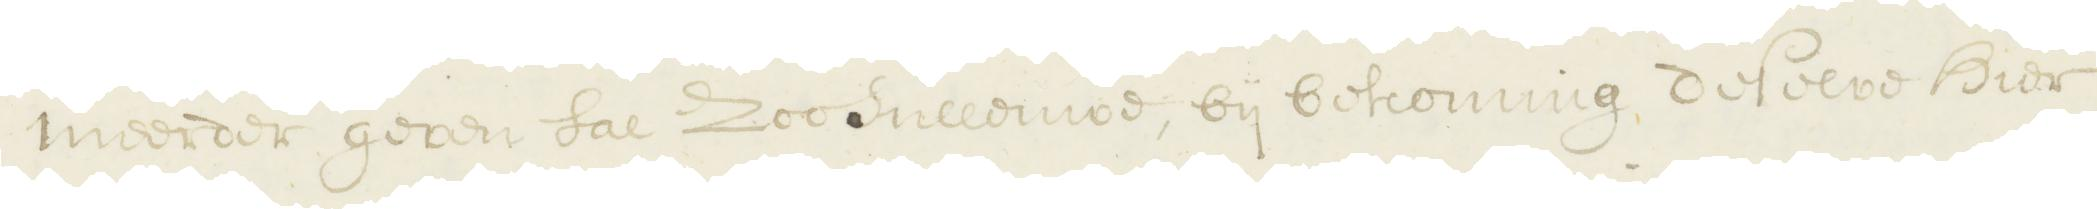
meerder geven sal zoo sullenwe, bij bekoming, deselve hier
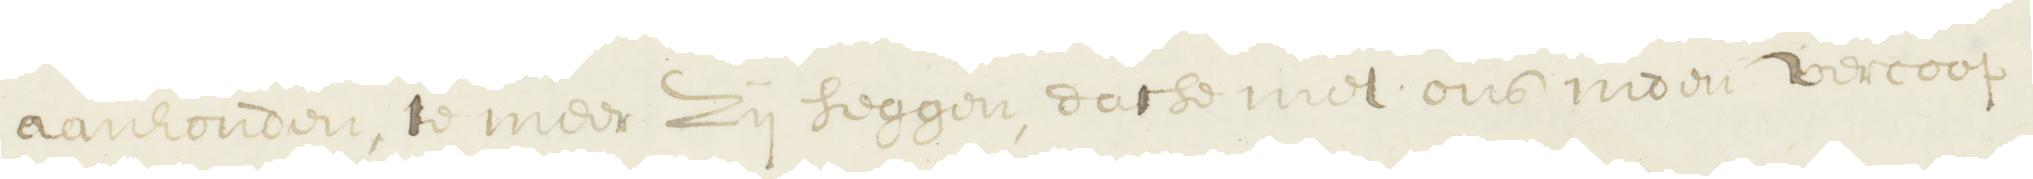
aanhouden, te meer zij seggen, datse met ons inden vercoop
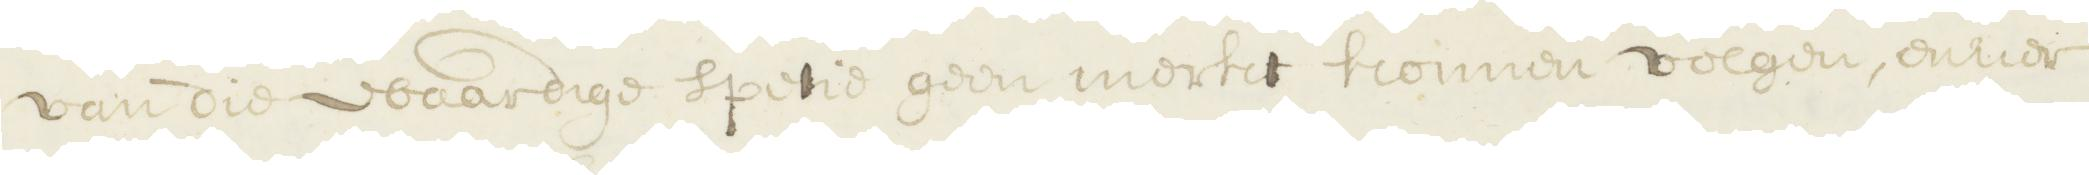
van die waardige spetie geen merkt konnen volgen, en hier
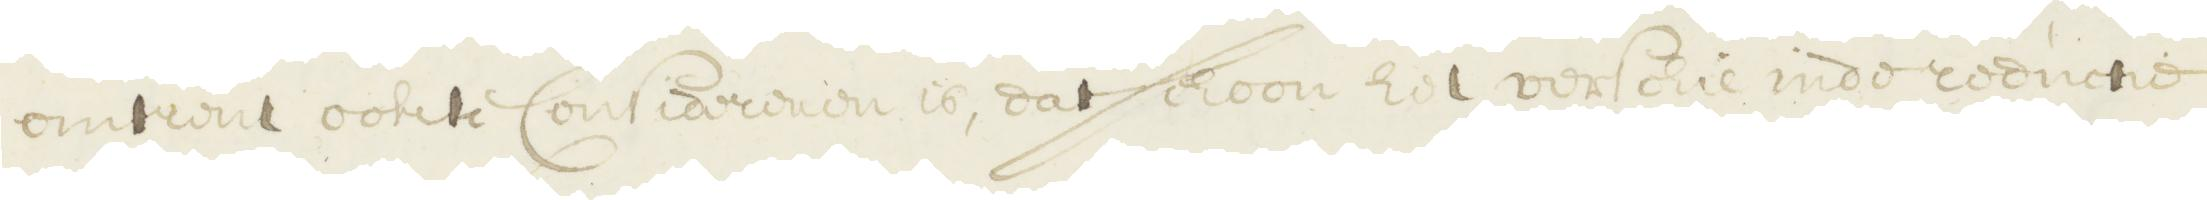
omtrent ook te considereren is, dat schoon het verschil inde reductie
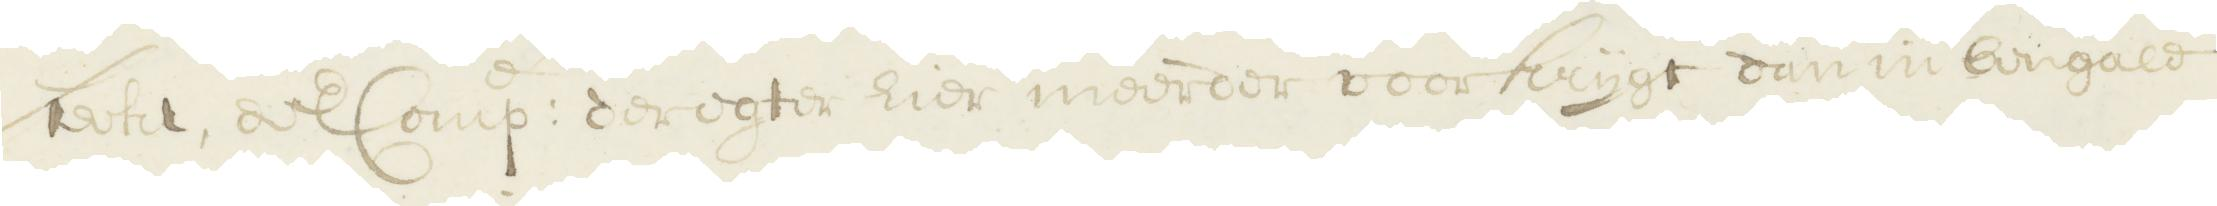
steekt, de E Comp: der egter hier meerder voor krijgt dan in bengale
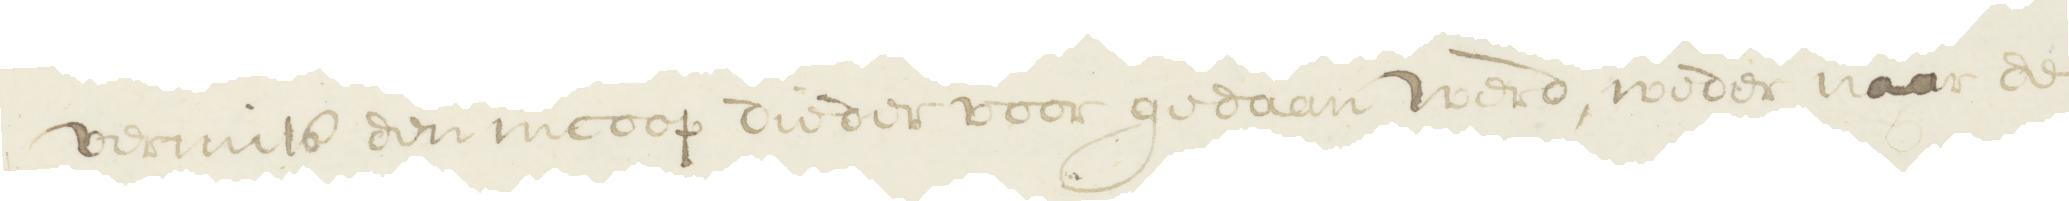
vermits den in coop die der voor gedaan werd, weder naar de
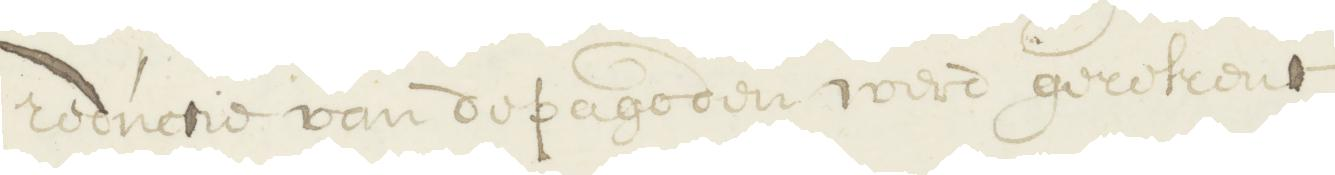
reductie van de pagoden werd gerekent
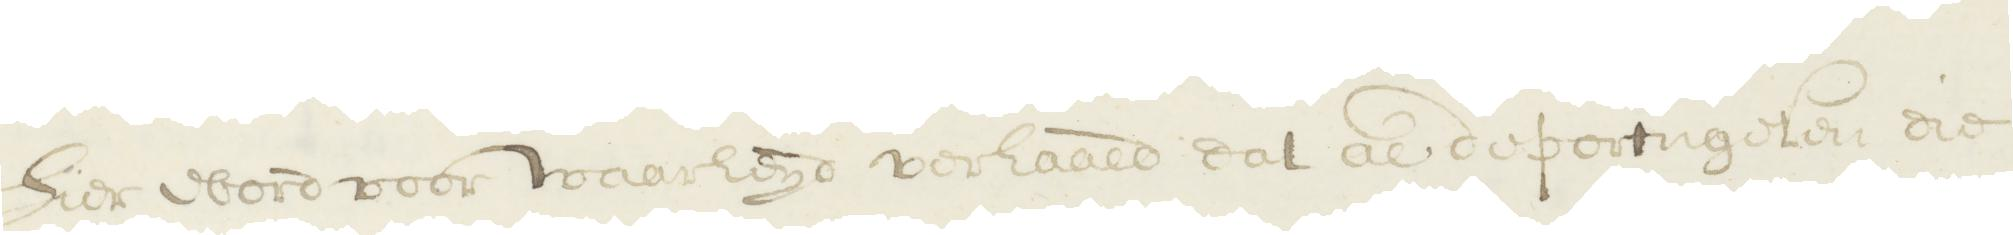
Hier word voor waarheijd verhaald dat al de portugesen die
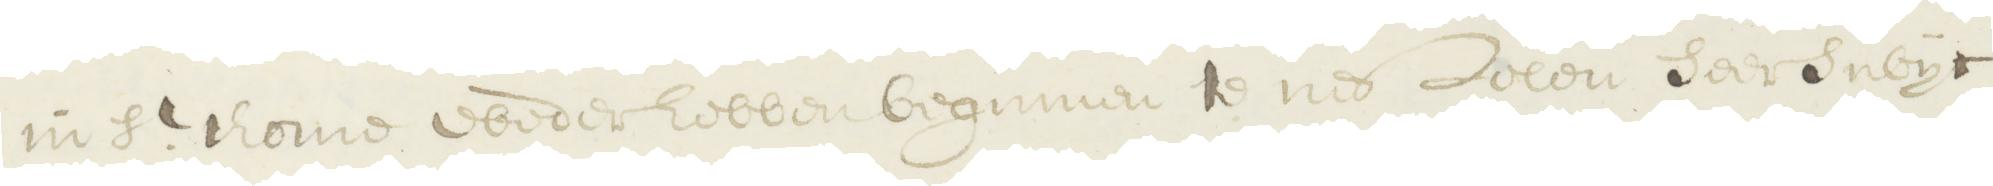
in s.t thome weder hebben beginnen te nestelen, seer subijt
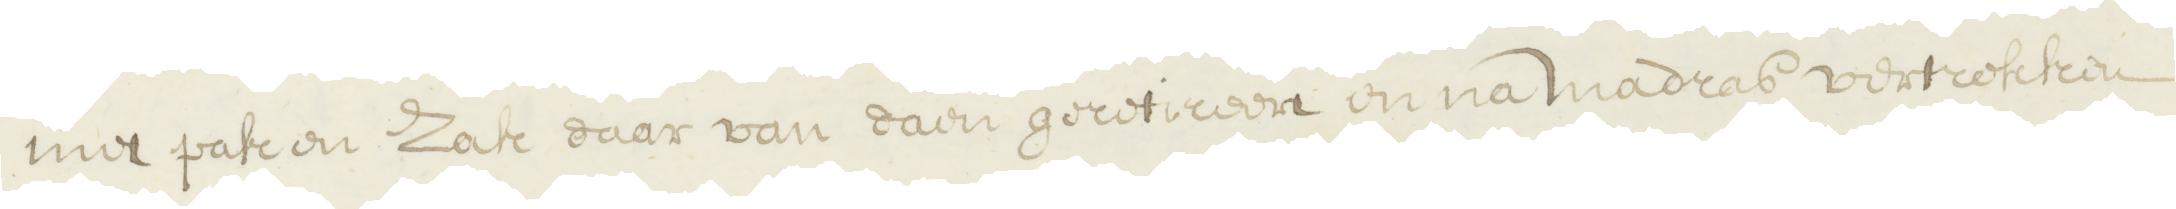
met pak en zak daar van daer geretireert en na madras vertrokken
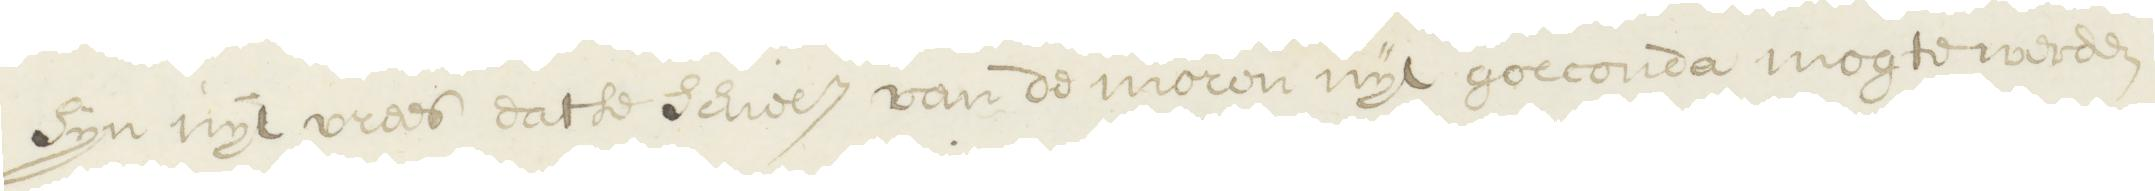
sijn uijt vrees datse schielijk van de moren uijt goeconda mogte werden
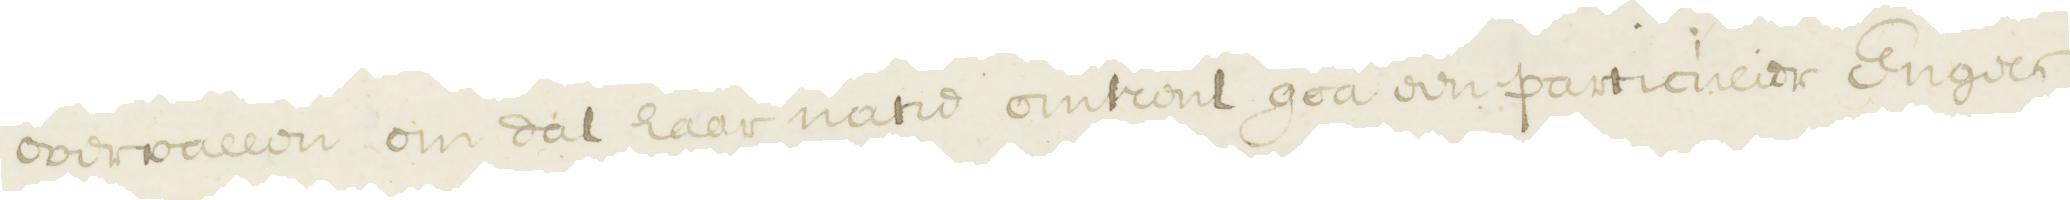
overvallen om dat haar natie omtrent goa een particulier Engels
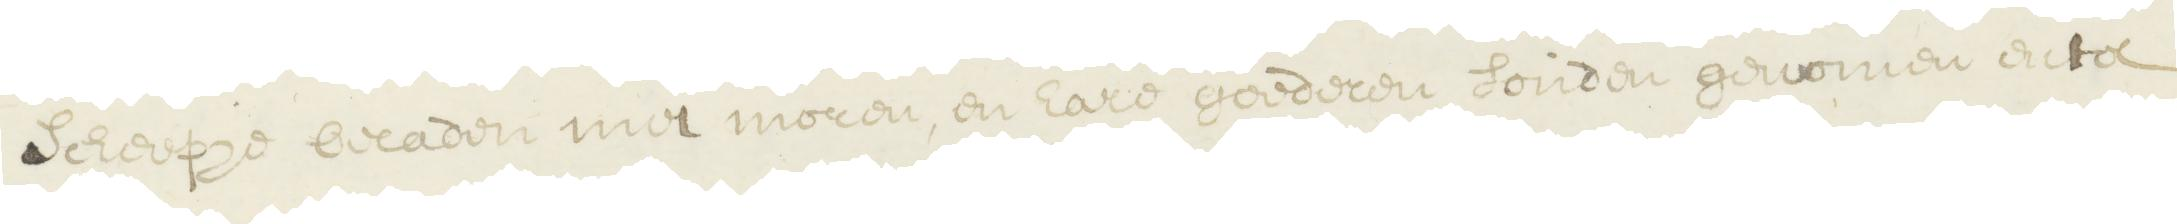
scheepje beladen met moren, en hare goederen souden gewonnen en tot
